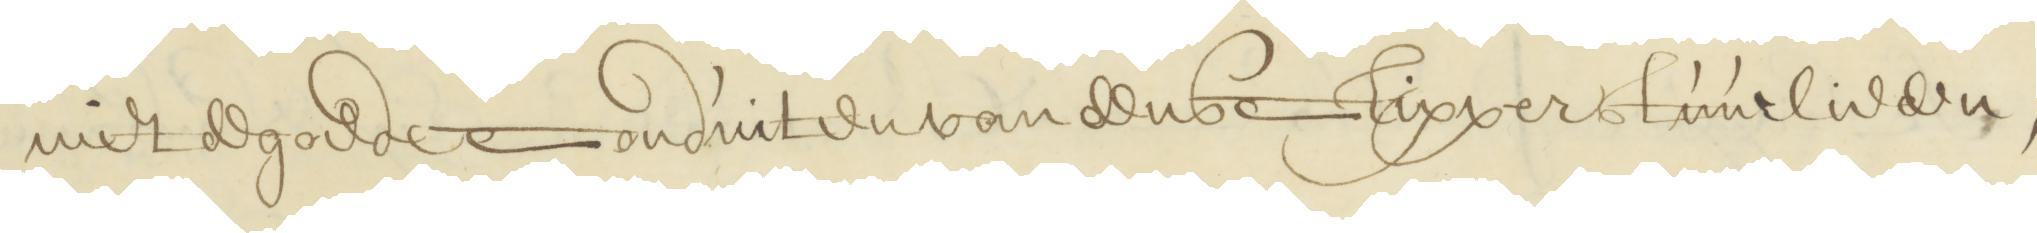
niet de goede conduiten van den schipperstuurlieden,
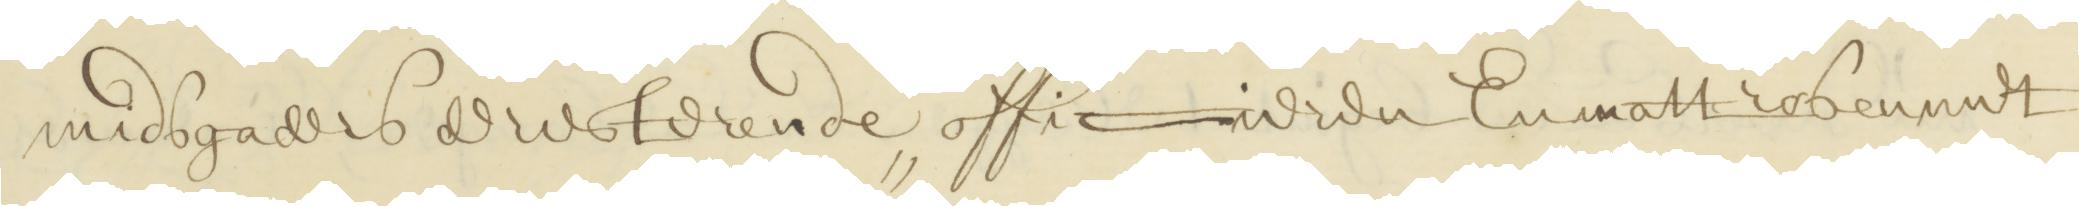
midsgaders de resterende „ officieren En mattrosen met
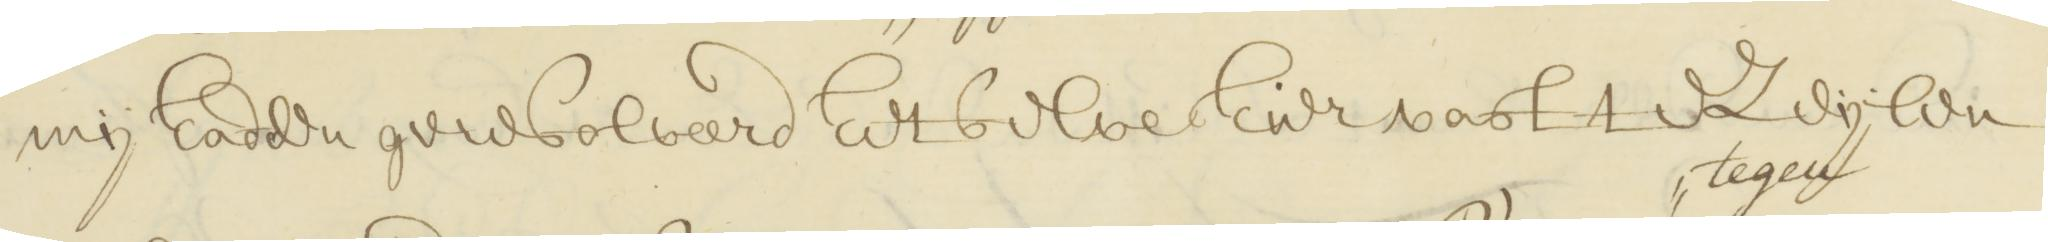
mij hadden geresolveerd het selve hier vast te zeijlen
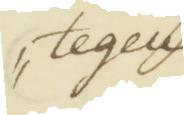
„ tegen
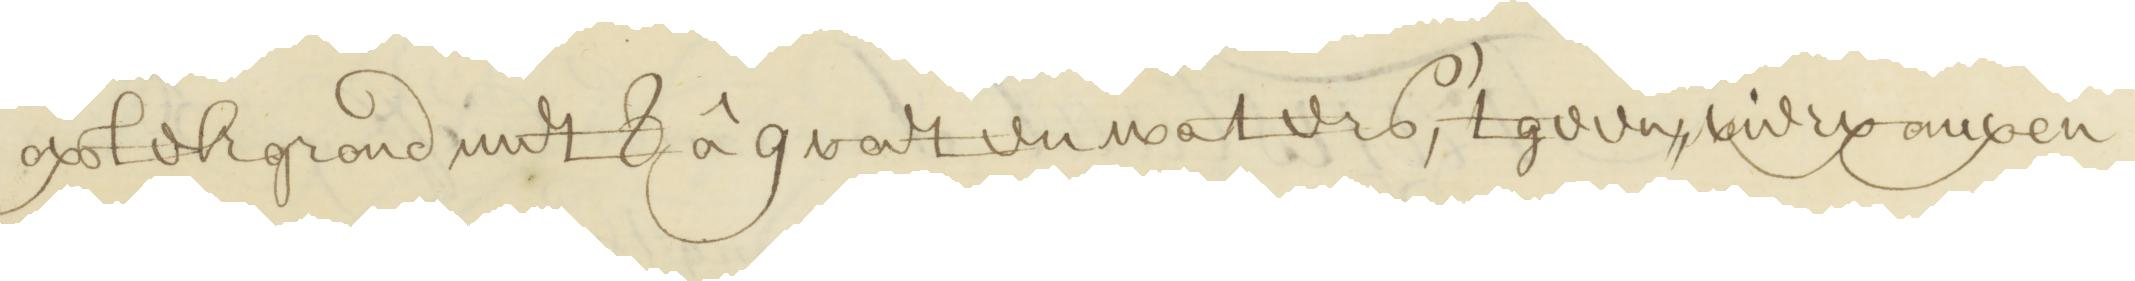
opstek grond met 8 â 9 voeten waters, 't geen „ vierpompen
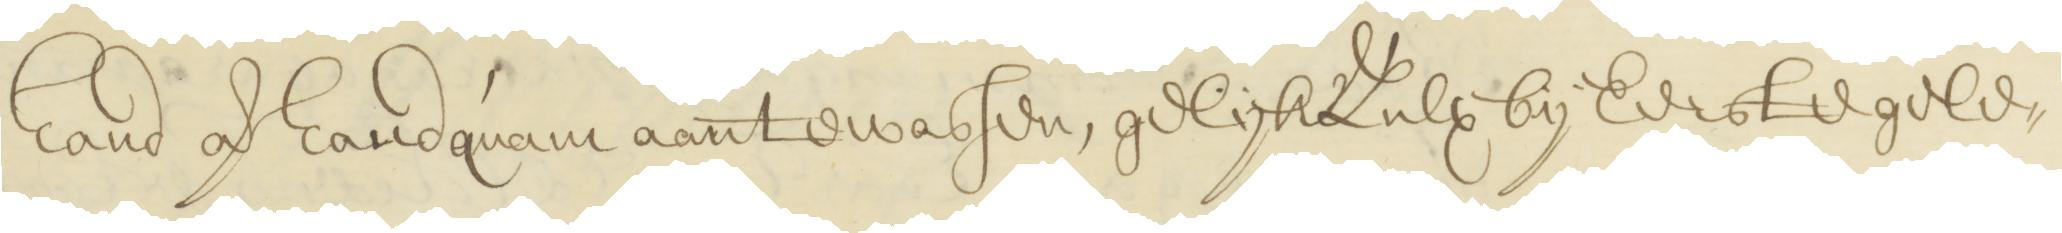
hand overhand quam aantewassen, gelijk zulx bij Eerste gele„
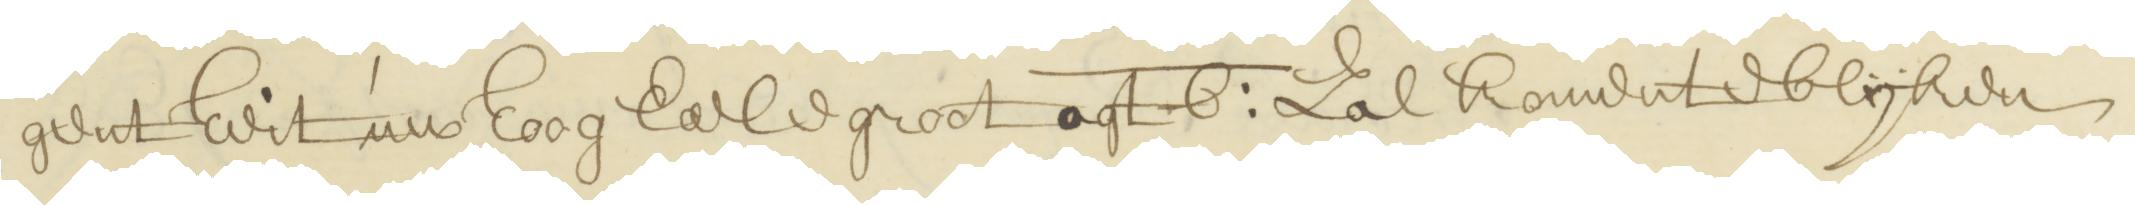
gentheit uw hoog Edele groot agtb: zal komen te blijken
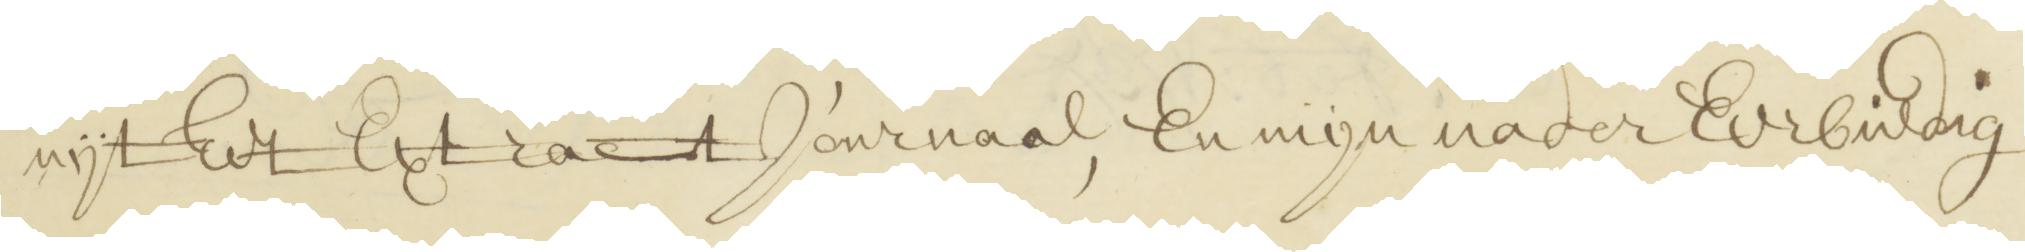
uijt het Extract Journaal, En mijn nader Eerbiedig
